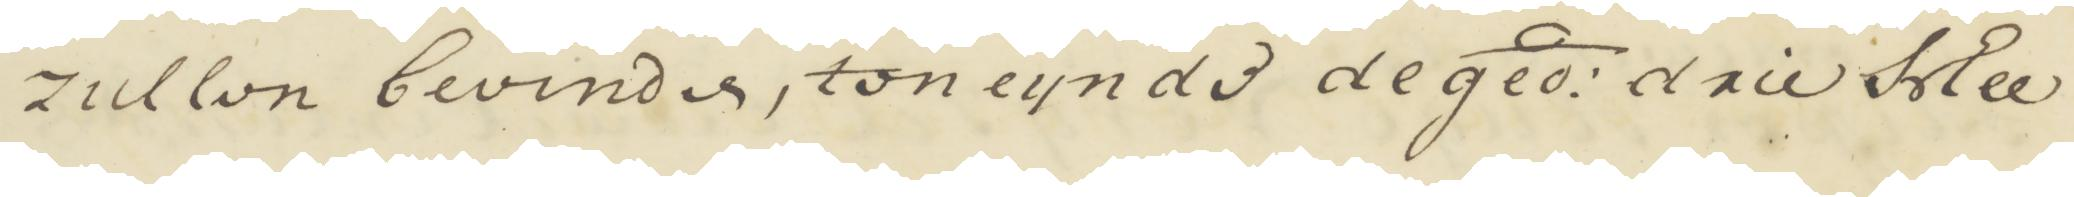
zullen bevinden, ten eynde de ged: drie schee
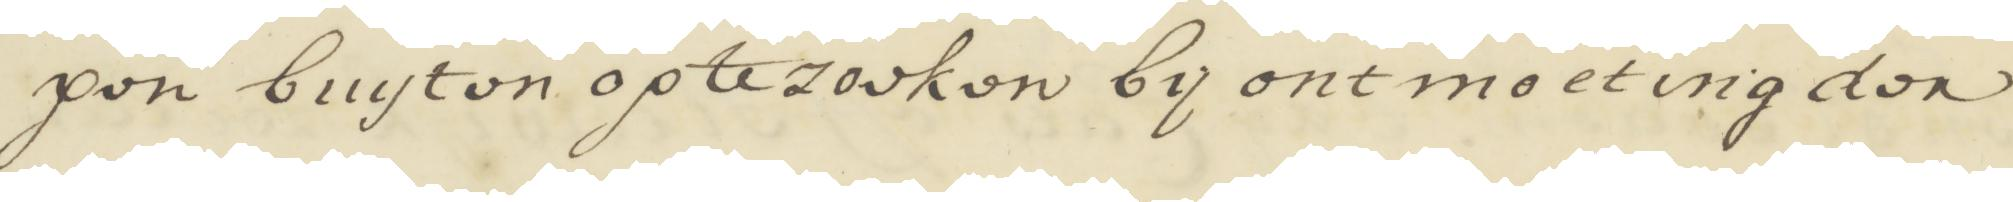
pen buyten op te zoeken bij ontmoeting der
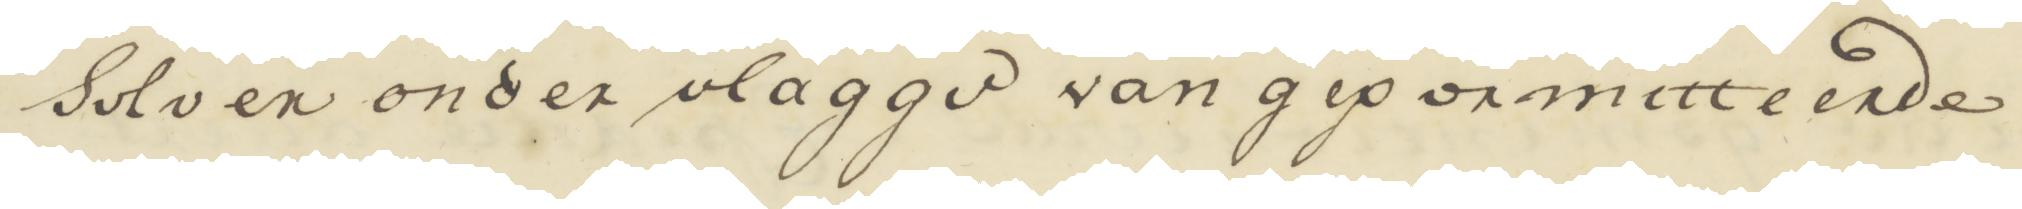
selver onder vlagge van gepermitteerde
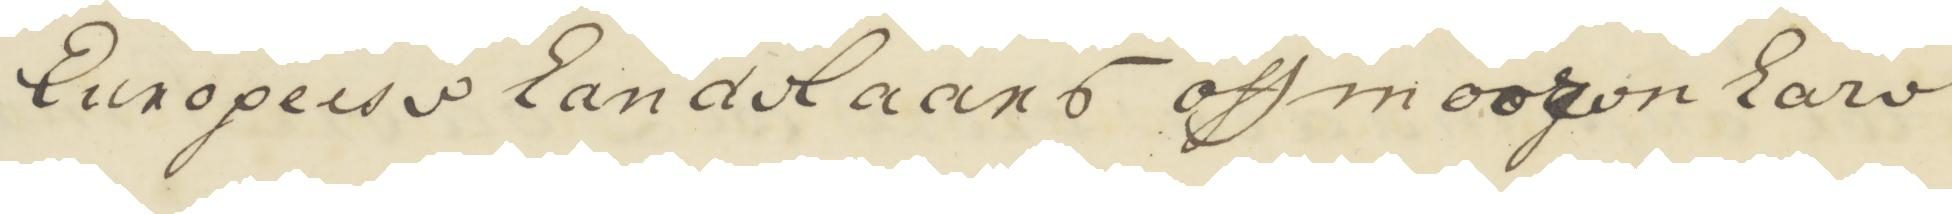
Europeese handelaars off moogen hare
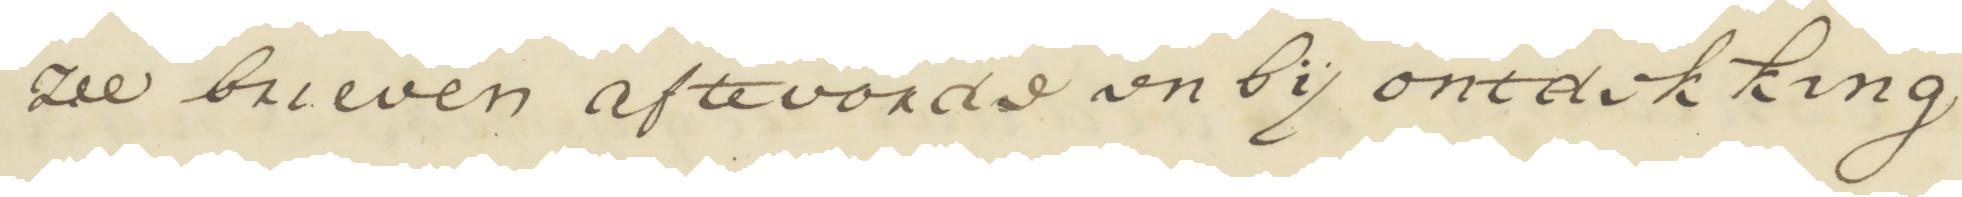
zee brieven af te vorde en bij ontdekking
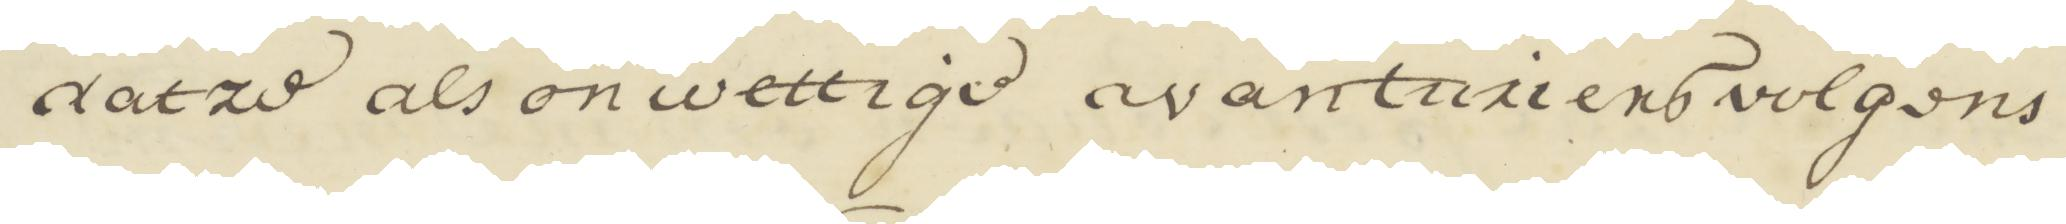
dat ze als onwettige avonturiers volgens
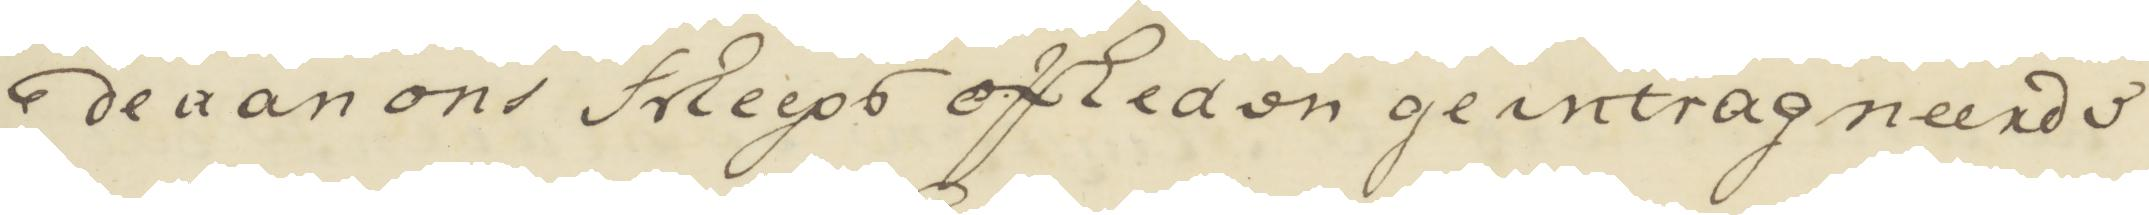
de aan ons scheeps overheden geintragneerde
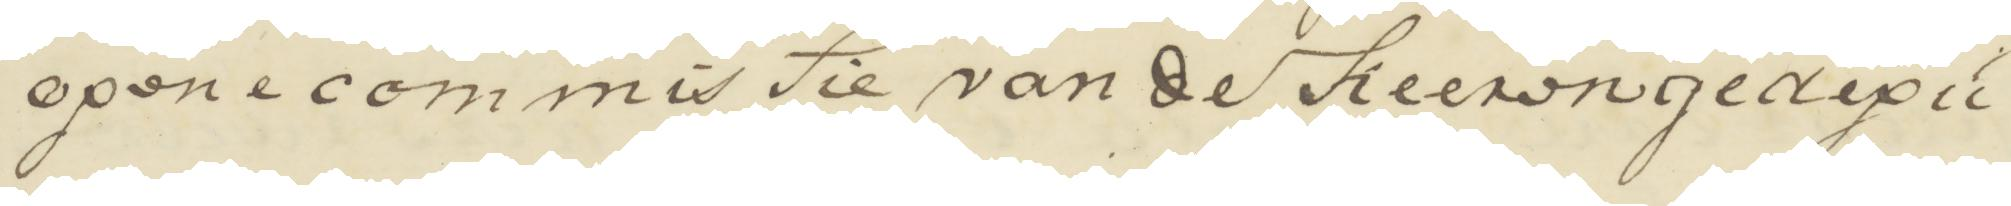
opene commis sie van de Heeren gedepu
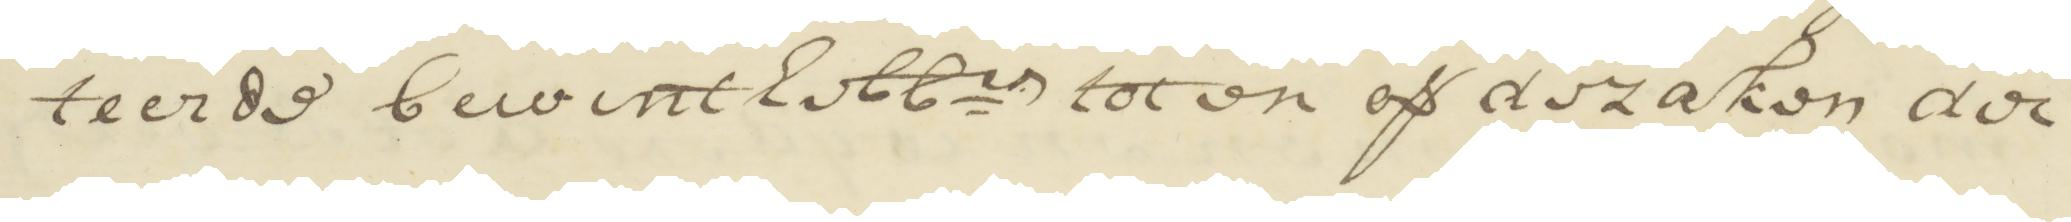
teerde bewinthebb=en tot en over de zaken der
